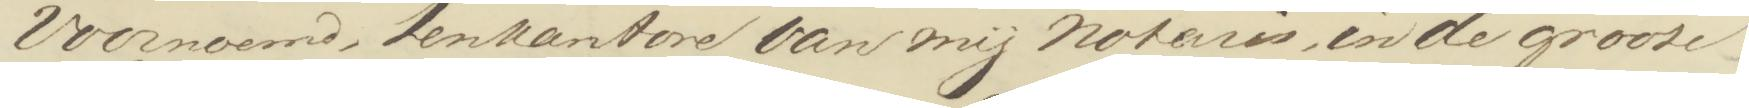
voornoemd, ten kantore van mij notaris, in de groote
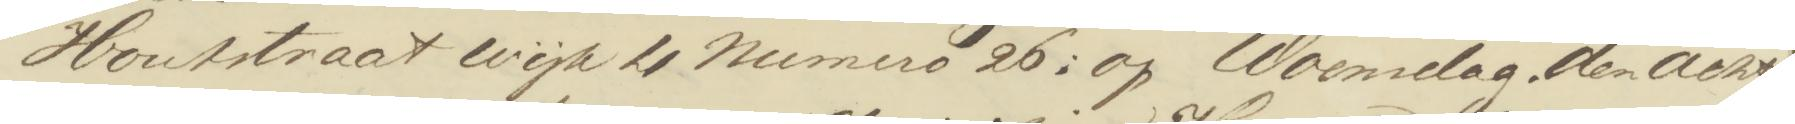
Houtstraat wijk 4 Numero 26; op Woemdag, den acht
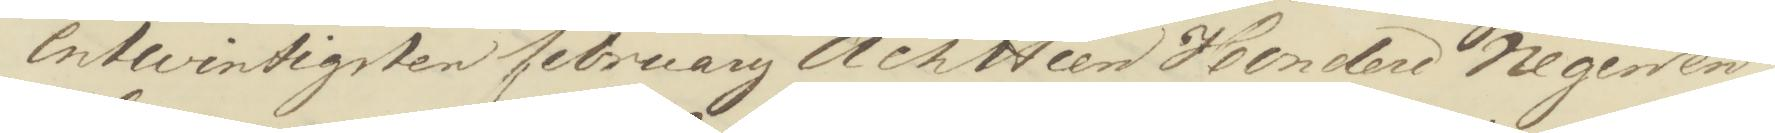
entwintigsten february Achttien Honderd Negen en
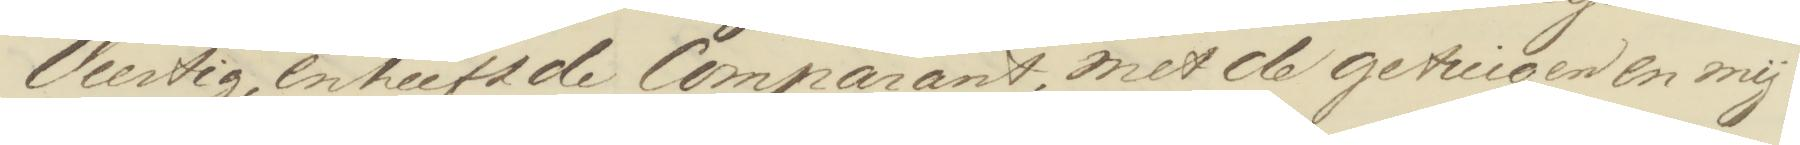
Veertig, en heeft de Comparant, met de getuigen en mij
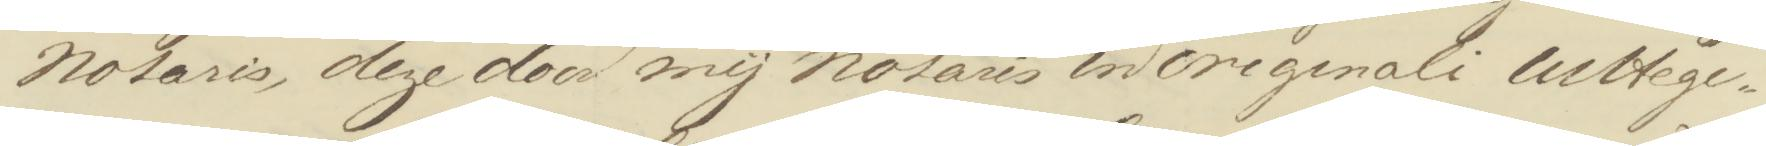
Notaris, deze door mij notaris in originali uittege„
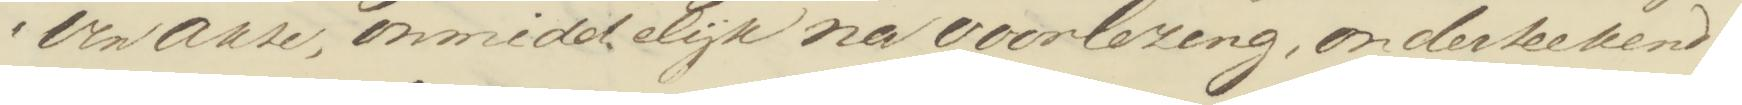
,ven akte, onmiddelijk na voorlezing, onderteekend.
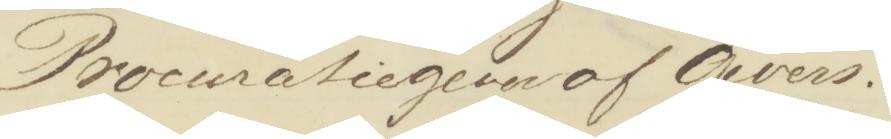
Procuratiegever of Gevers.
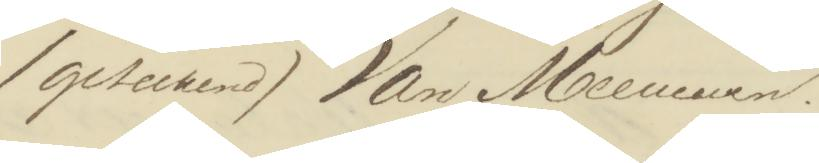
/geteekend/ Van Meeuewen
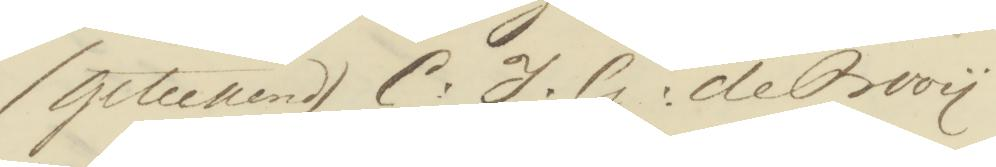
/geteekend/ C: I: G: de Booij
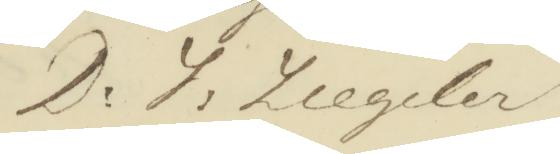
D: I: Ziegeler
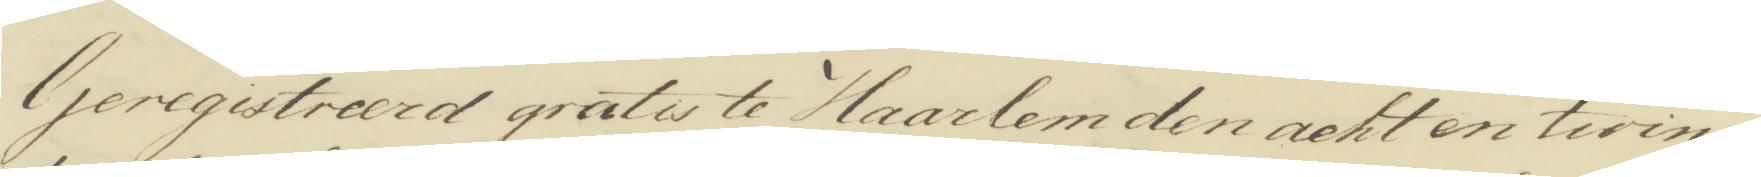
Geregistreerd gratis te Haarlem den acht en twin
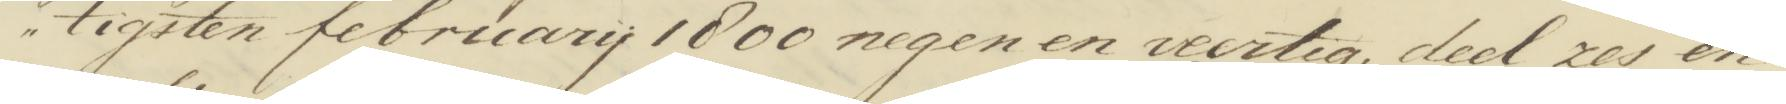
„tigsten februarij 1800 negen en veertig, deel zes en
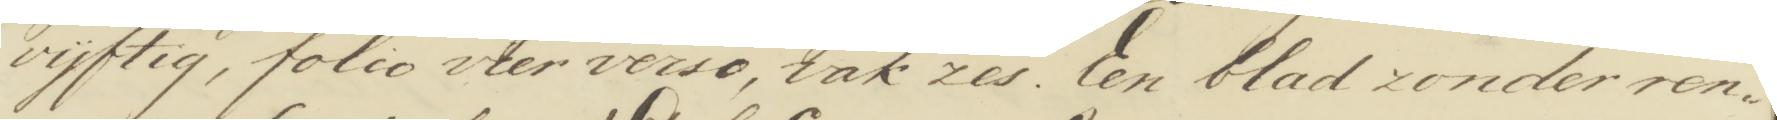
vijftig, folio vier verso, vak zes. Een blad zonder ren„
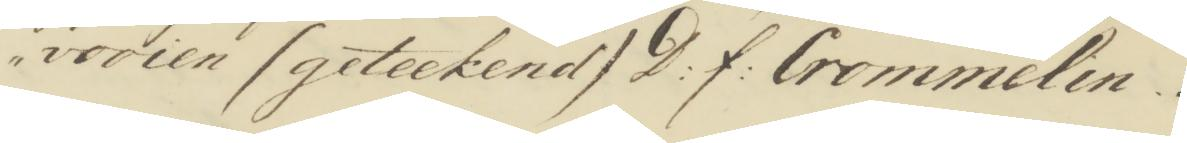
„vooien /geteekend/ D: F: Crommelin.
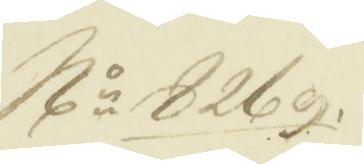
N=o 8269.
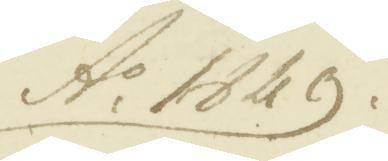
A:o 1849:
